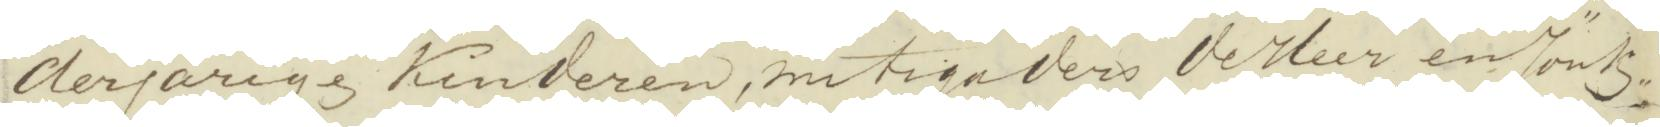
derjarige Kinderen, mitsgaders deHeer en Jonk„
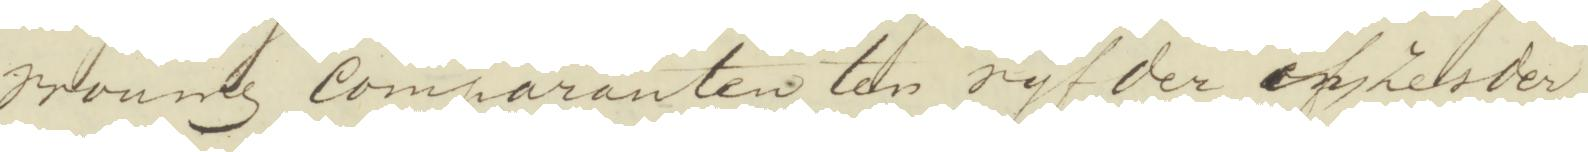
vrouwe Comparanten ten vyfder en zesder
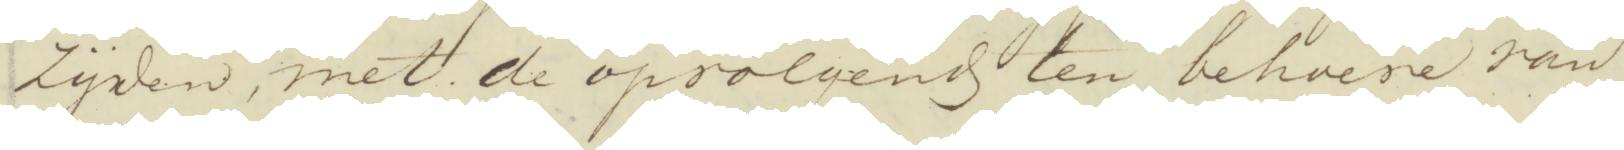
zijden, met de opvolgend ten behoeve van
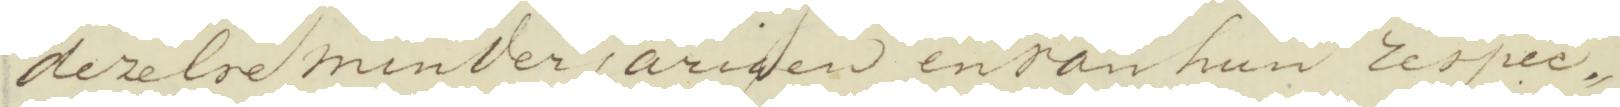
dezelve minder jarigen envan hun respec„
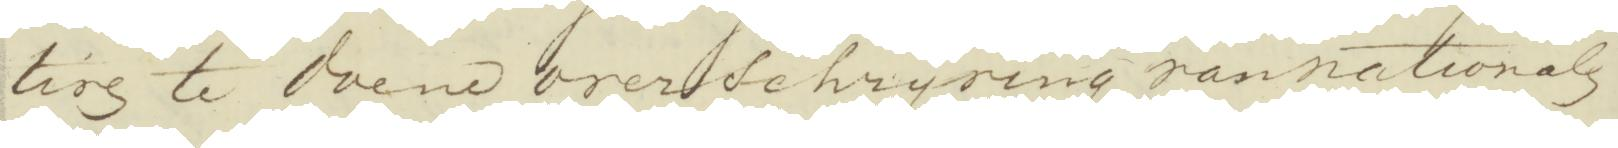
tive te doene overschrijving vannationale
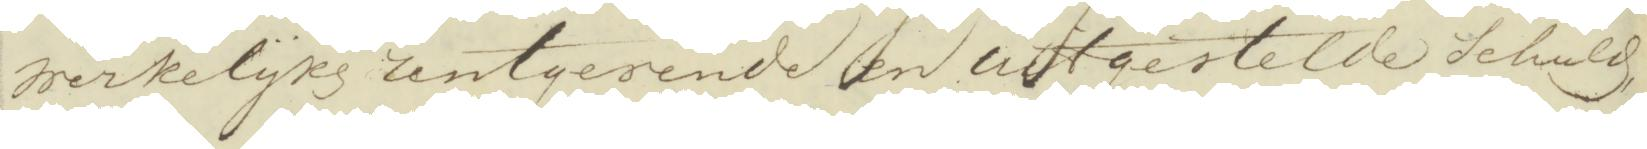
werkelijke rentgevende en uitgestelde schuld,
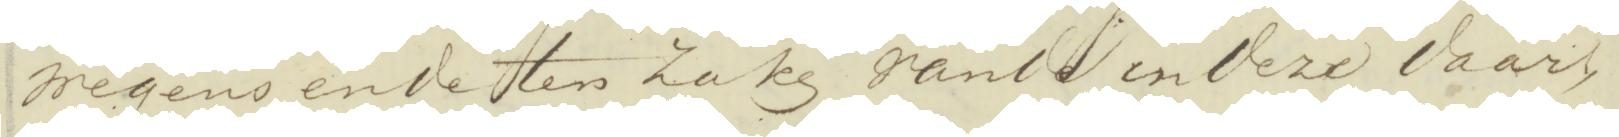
wegens ende ter zake vande in deze daar„
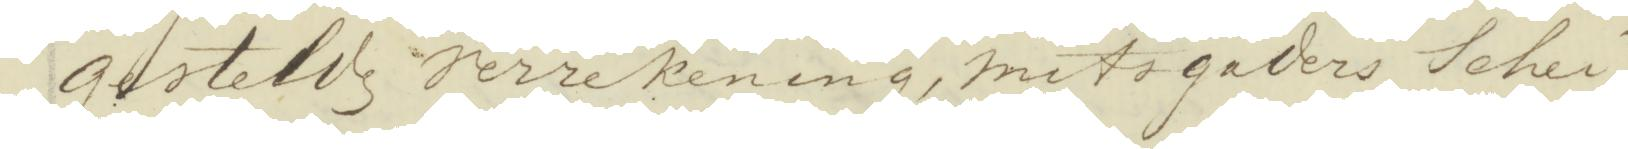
gestelde verrekening, mitsgaders schei
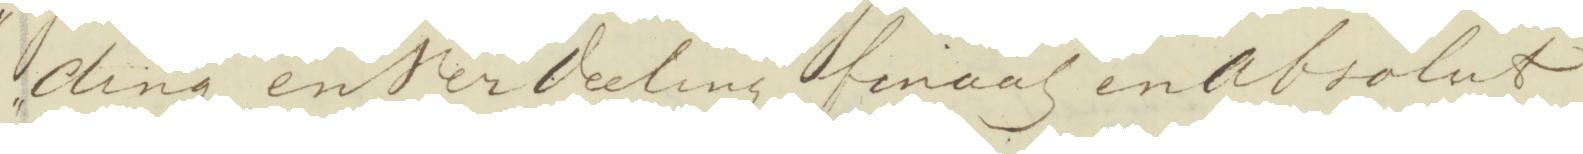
„ding en Verdeeling finaal enAbsolut
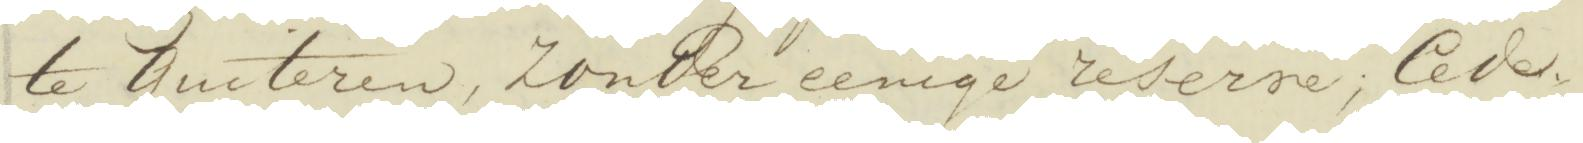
te quiteren, zonder eenige reserve; Cede„
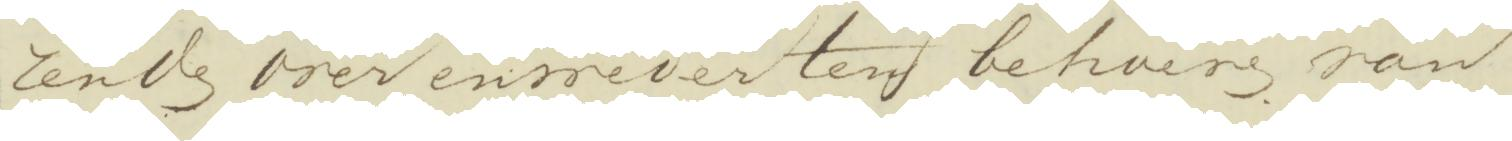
rende over enweder ten behoeve van
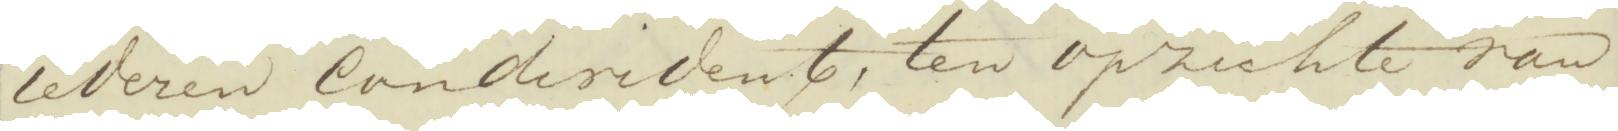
iederen condirident, ten opzichte van
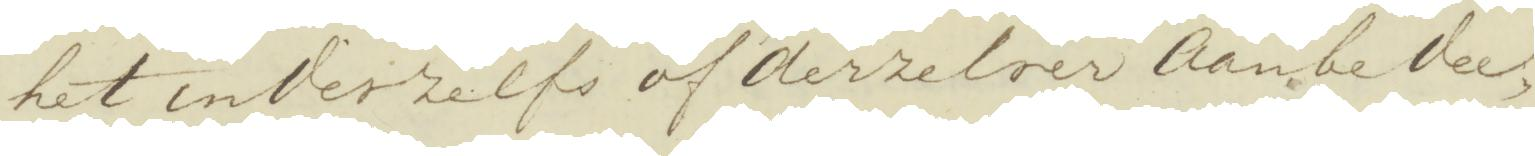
het indeszelfs of derzelver Aanbedee„
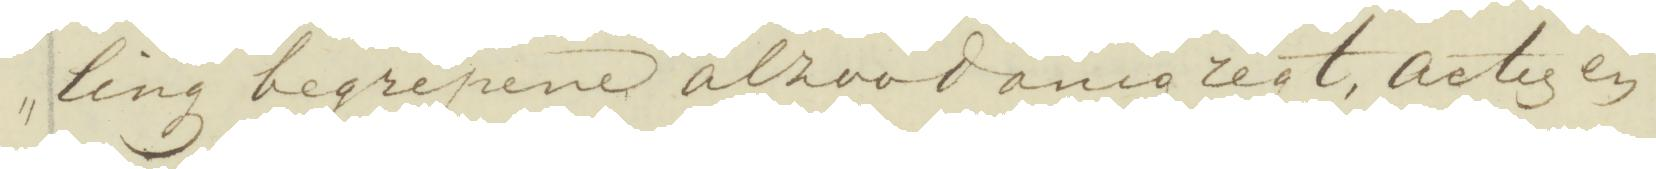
„ling begrepene alzoodanig regt, actie en
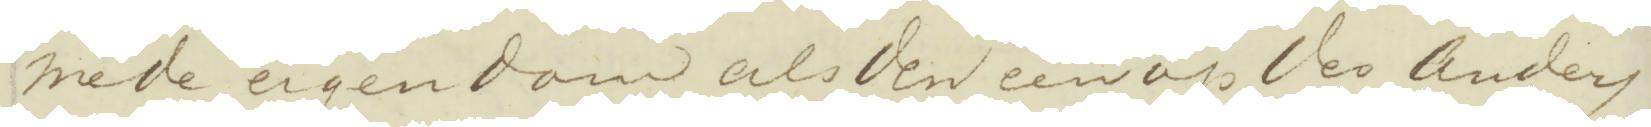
mede eigendom als den een op des anders
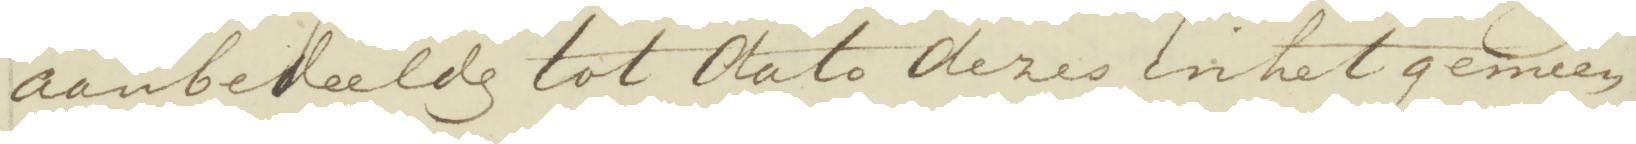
aanbedeelde tot dato dezes in het gemeen
